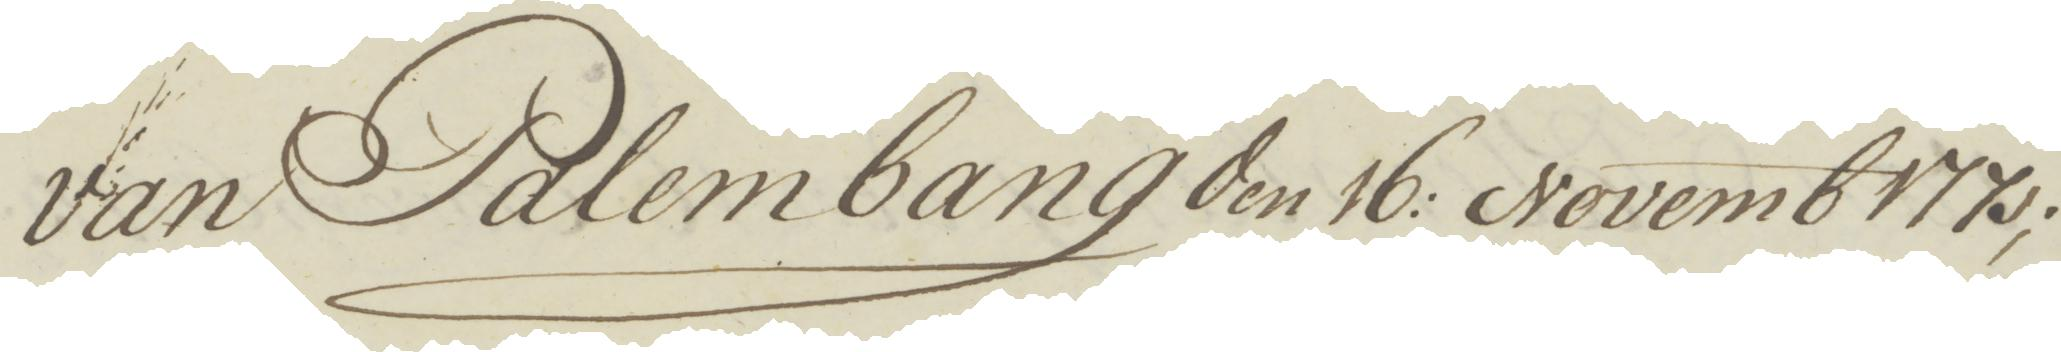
van Palembang den 16: Novemb 1775;
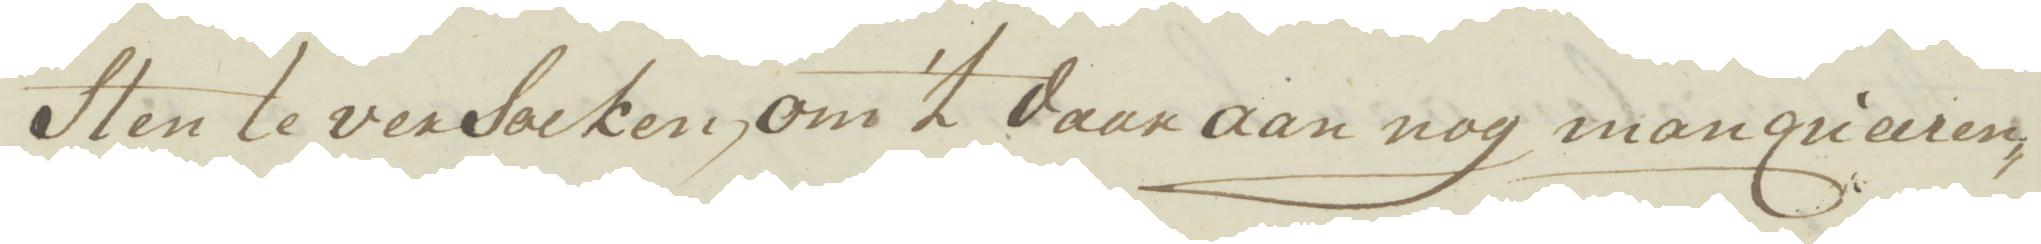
sten te versoeken, om ’t daar aan nog manqueeren„
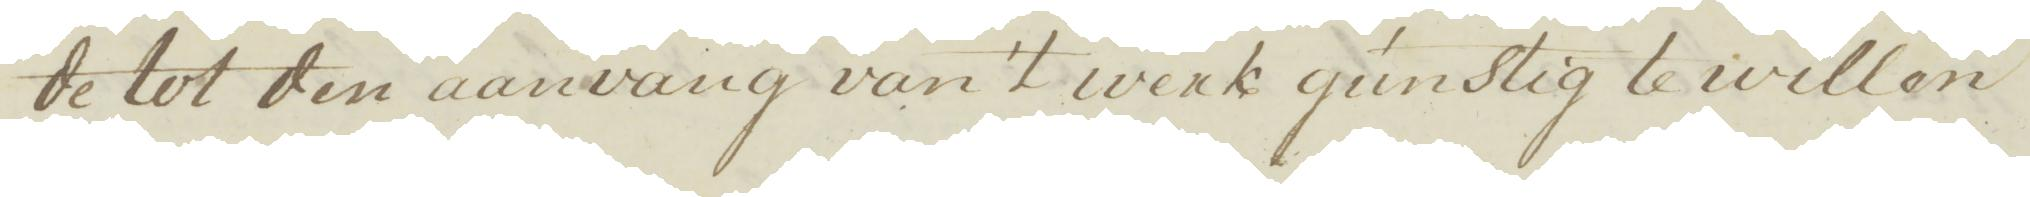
de tot den aanvang van ’t werk gunstig te willen
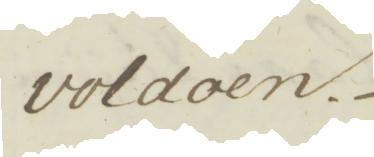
voldoen.
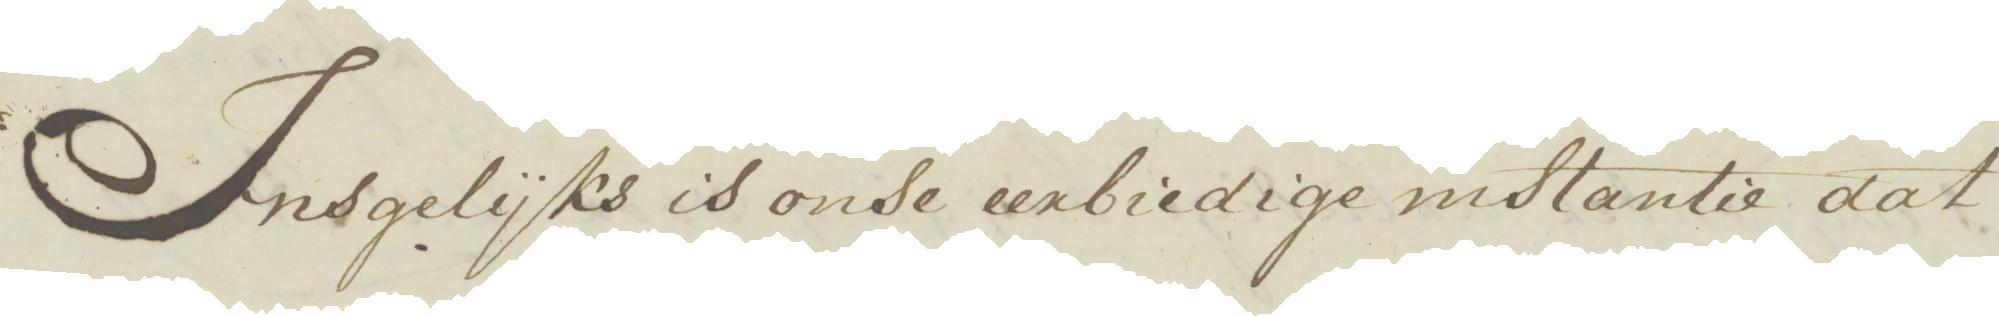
Insgelijks is onse eerbiedige instantie dat
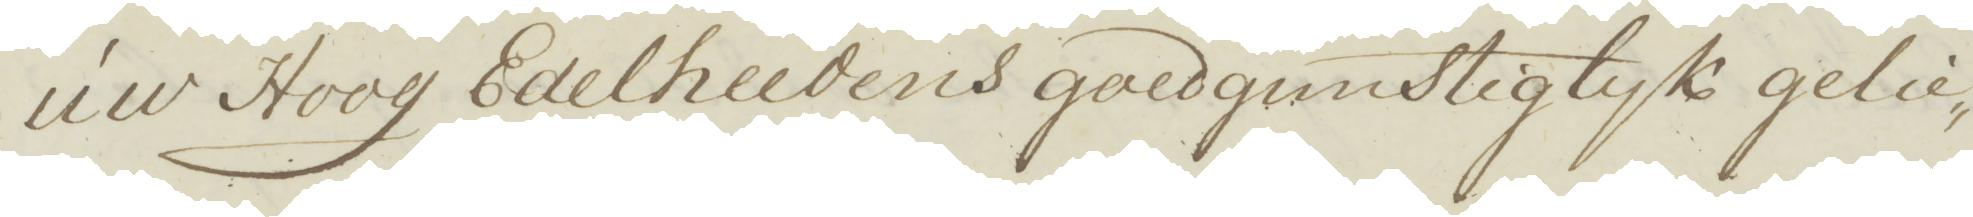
uw Hoog Edelheedens goedgunstiglijk gelie„
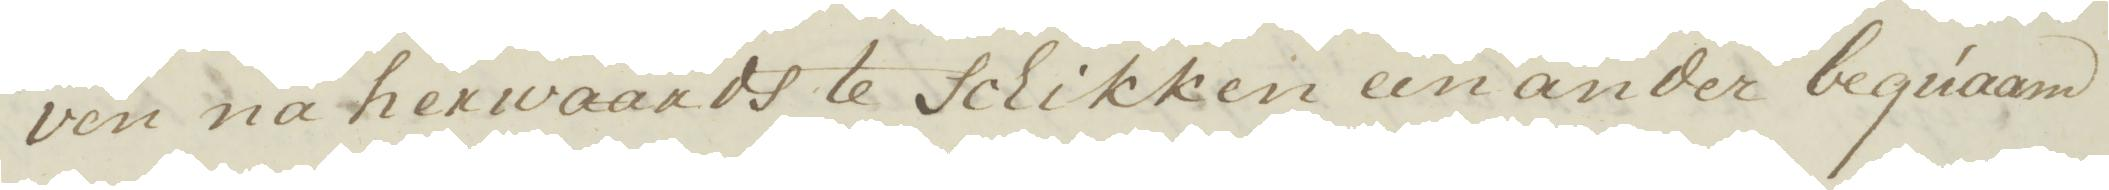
ven na herwaards te schikken een ander bequaam
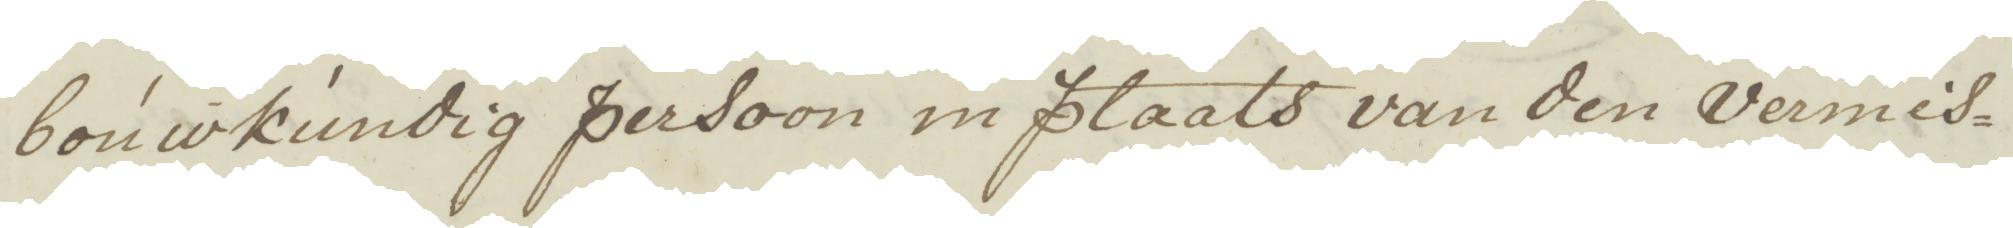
bouwkundig persoon in plaats van den vermis=
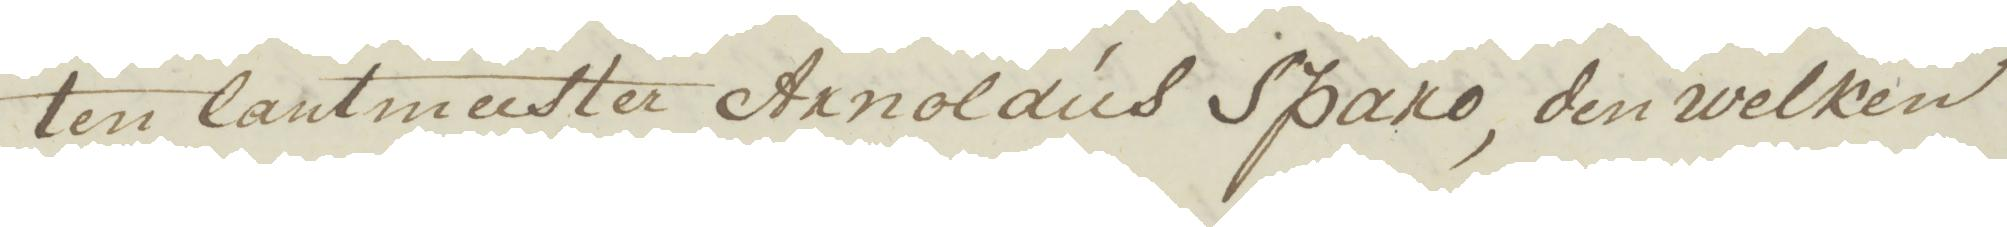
ten lantmeester Arnoldus sparo, den welken
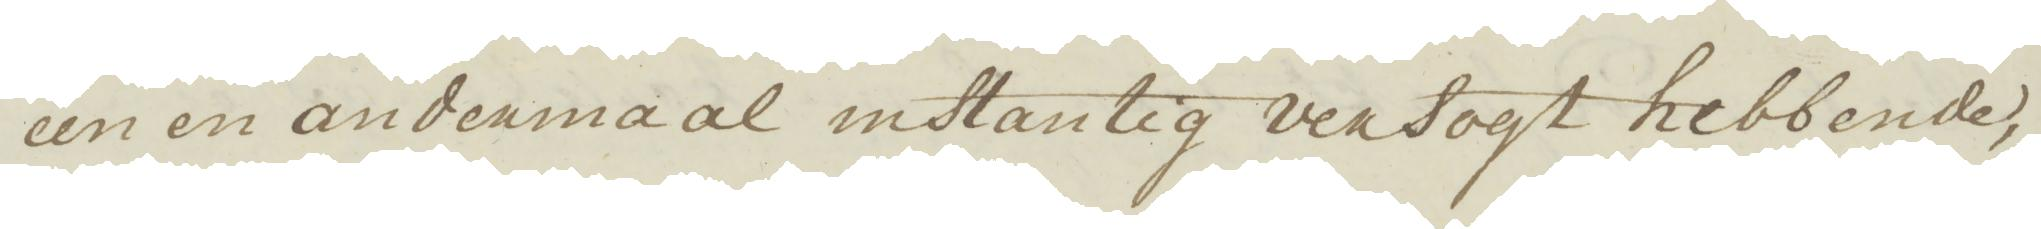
een en andermaal instantig versogt hebbende,
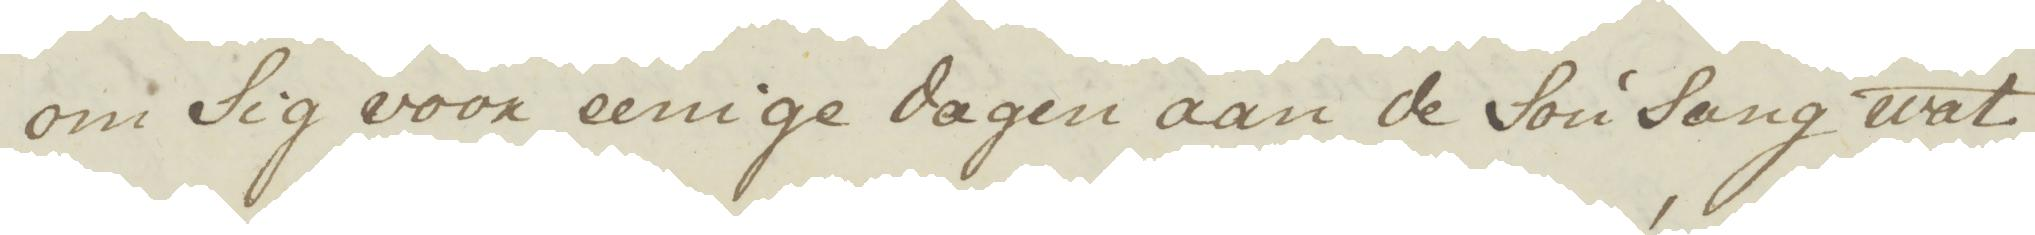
om sig voor eenige dagen aan de sousang wat
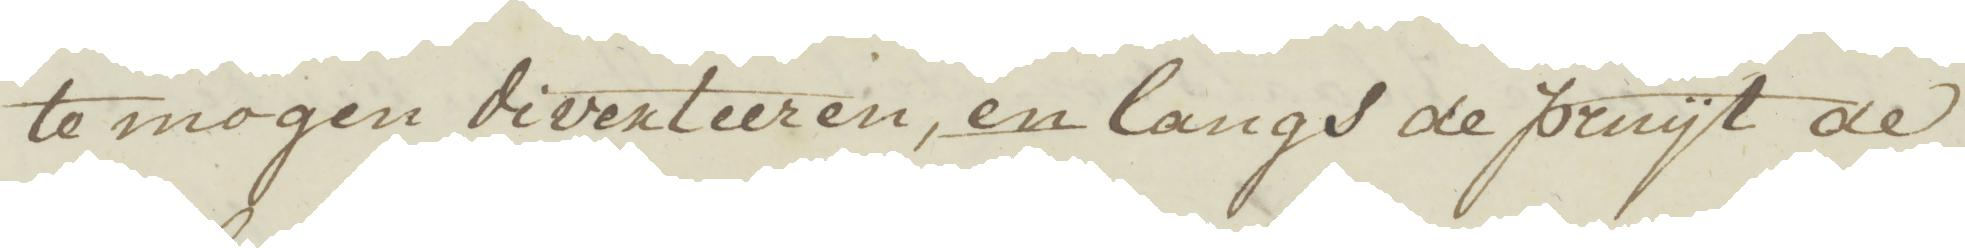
te mogen diverteeren, en langs de pruijt de
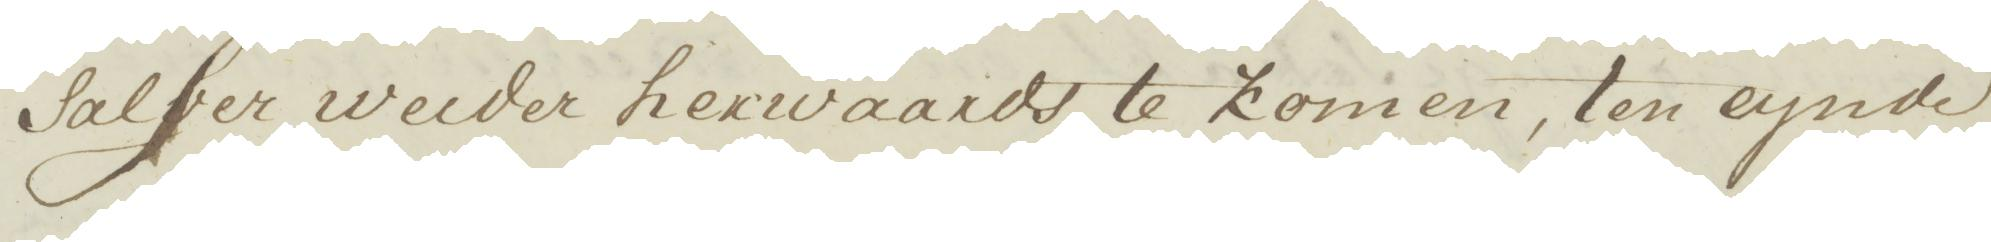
salser weeder herwaards te komen, ten eynde
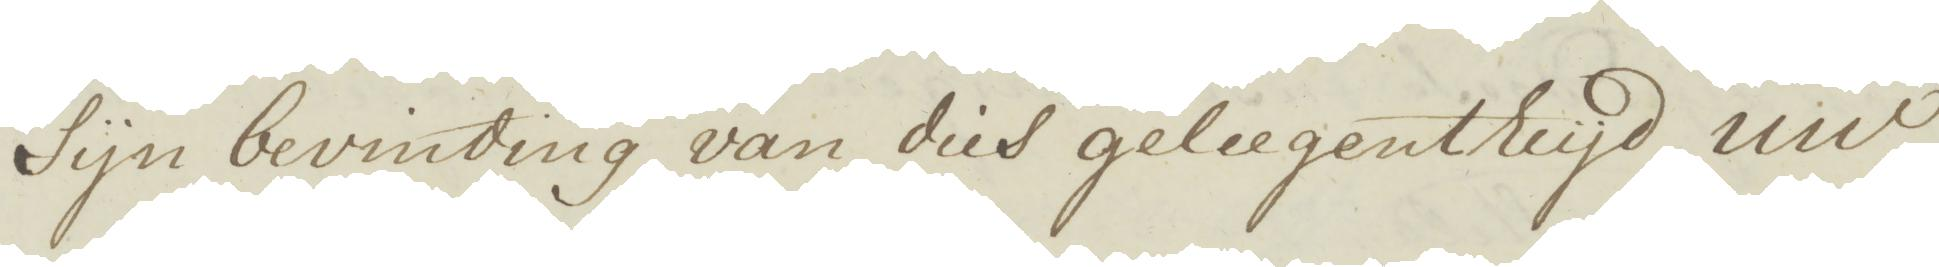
sijn bevinding van dies geleegentheijd uw
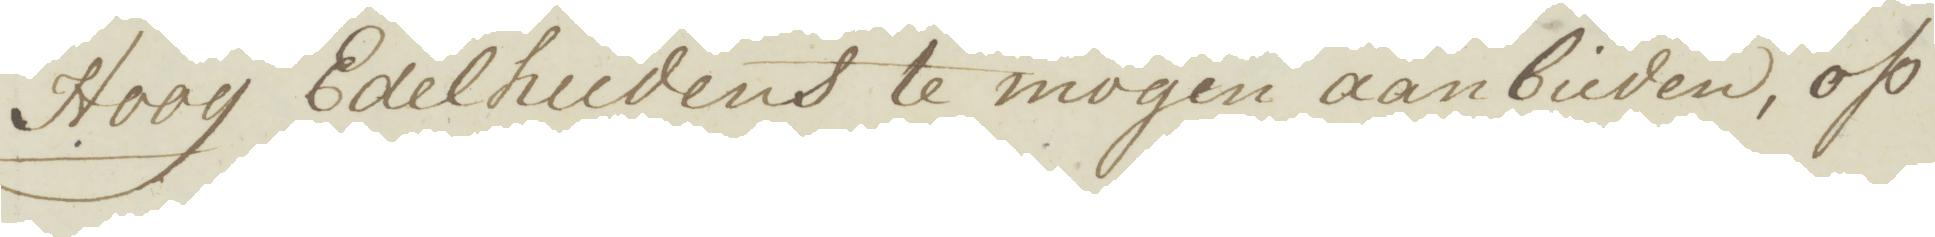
Hoog Edelheedens te mogen aan bieden, op
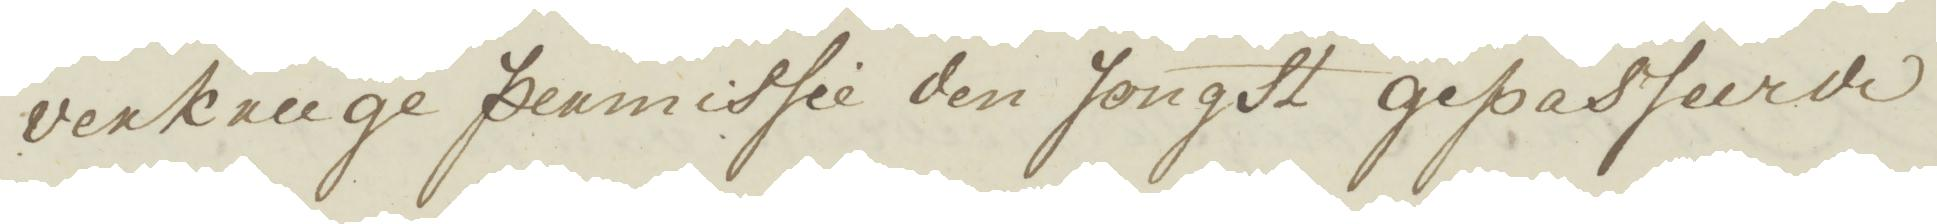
verkreege permissie den Jongst gepasseerde
